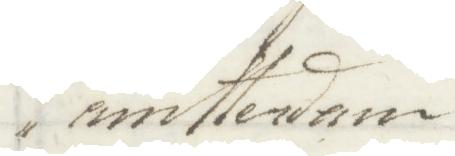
„ amsterdam
